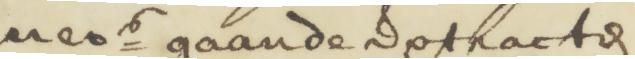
nev=s gaande Extracten
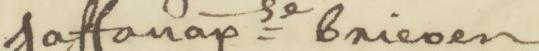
Jaffanap=se brieven
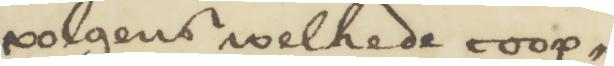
volgens welke de coop„
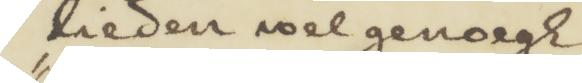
„lieden wel genoegh
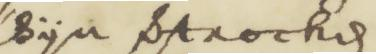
sijn vertrocken
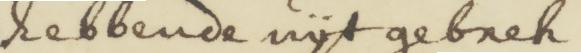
hebbende uijt gebrek
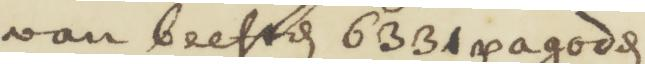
van beesten 6331 pagoden
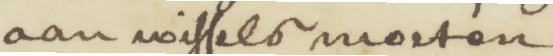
aan wissels moeten
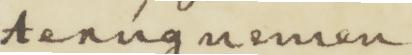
terug nemen
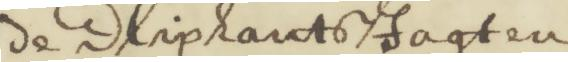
de Eliphants Jagten
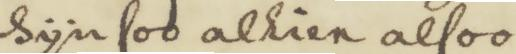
sijn soo alhier alsoo
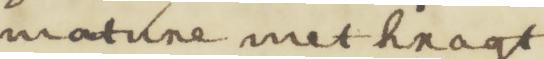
mature met kragt
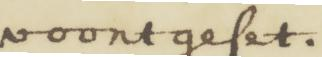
voortgeset.
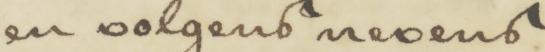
en volgens nevens
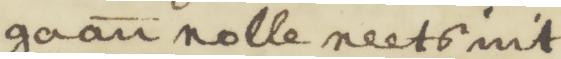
gaan rolle reets in’t
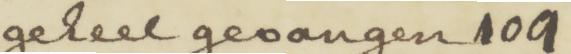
geheel gevangen 104
